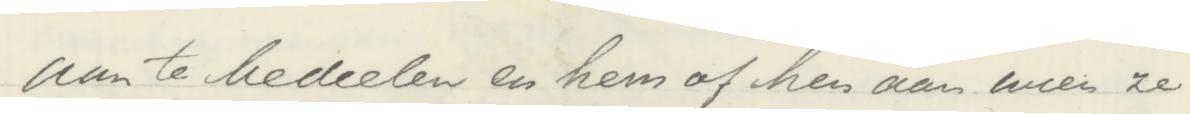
aan te bedeelen en hem of hen aan wien ze
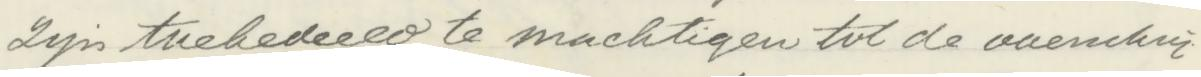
zijn toebedeeld te machtigen tot de overschrij
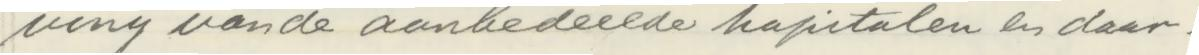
ving van de aanbedeelde kapitalen en daar
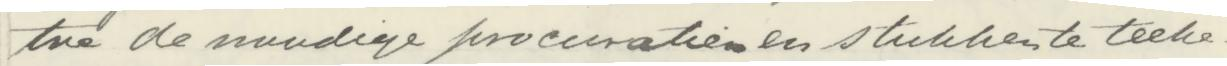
toe de noodige procuratien en stukken te teeke
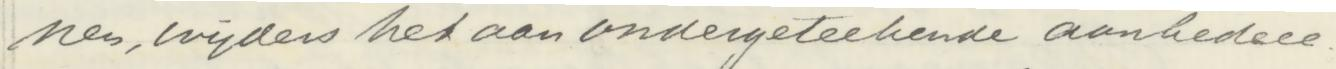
nen, wijders het aan ondergeteekende aanbedeel
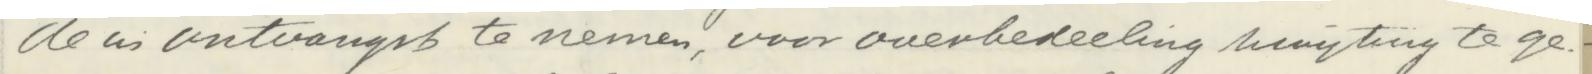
de in ontvangst te nemen, voor overbedeeling kwijting te ge.
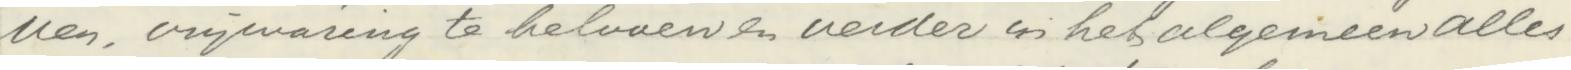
ven, vrijwaring te beloven en verder in het algemeen alles
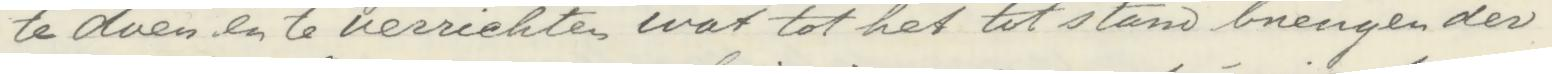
te doen en te verrichten wat tot het tot stand brengen der
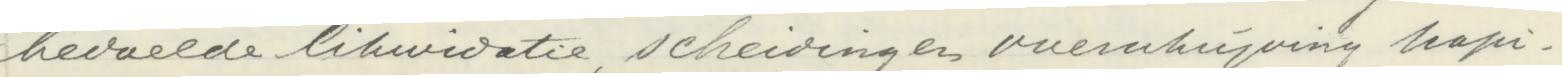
bedoelde likwidatie, scheiding en overschrijving kapi-
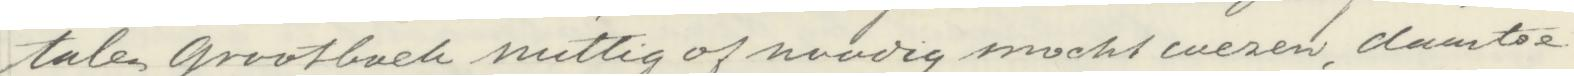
talen grootboek nuttig of noodig mocht wezen, daartoe
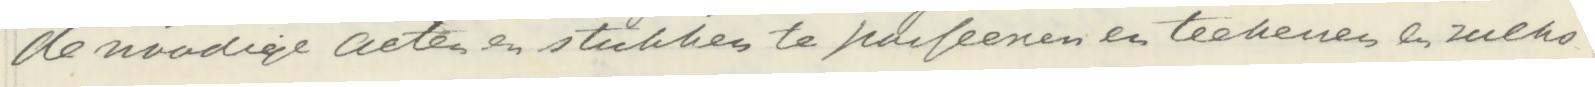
de noodige acten en stukken te passeeren en teekenen en zulks
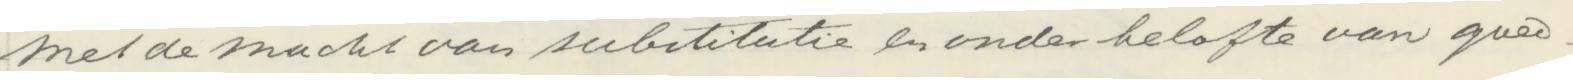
met de macht van substitutie en onder belofte van goed
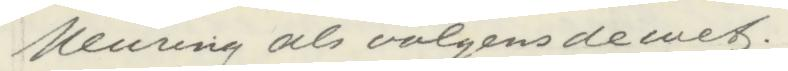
keuring als volgens de wet.
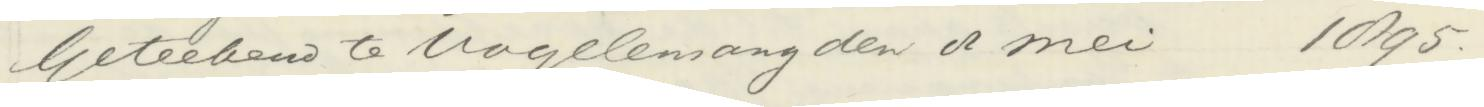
Geteekend te Vogelensang den 8 mei 1895.
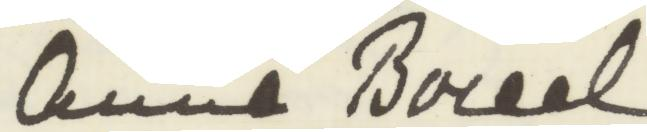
Anna Boreel
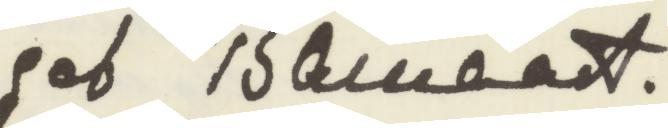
geb Barnaat.
